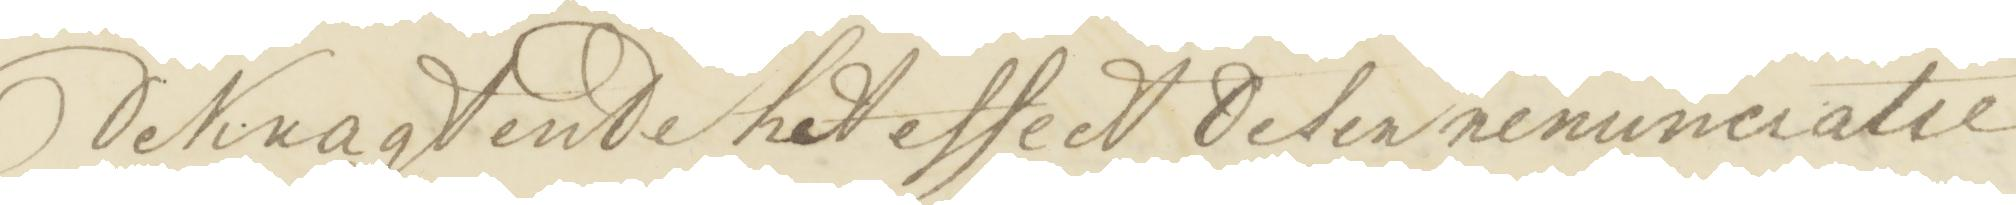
de Kragt ende het effect deser renunciatie
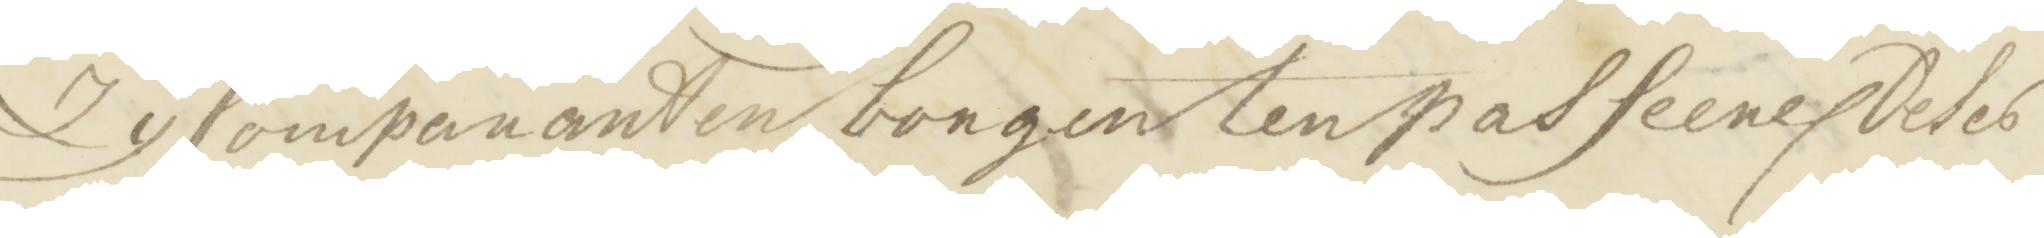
Zij Comparanten borgen ten passeere deses
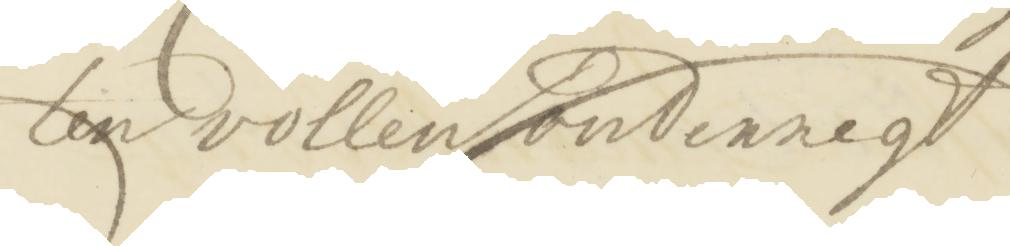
ten vollen onderregt
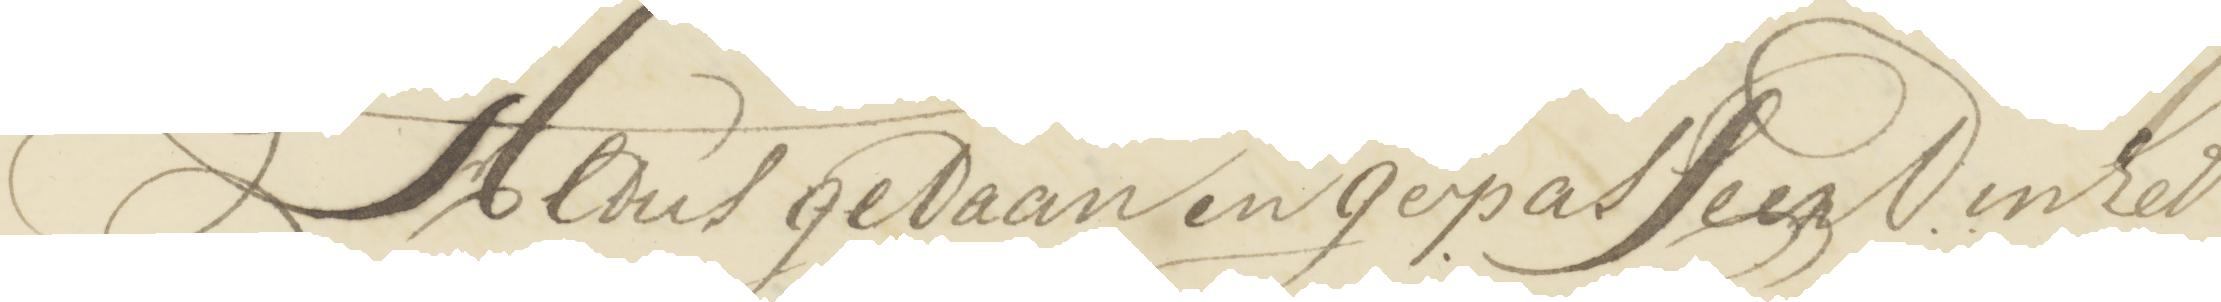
Aldus gedaan en gepasseerd in het
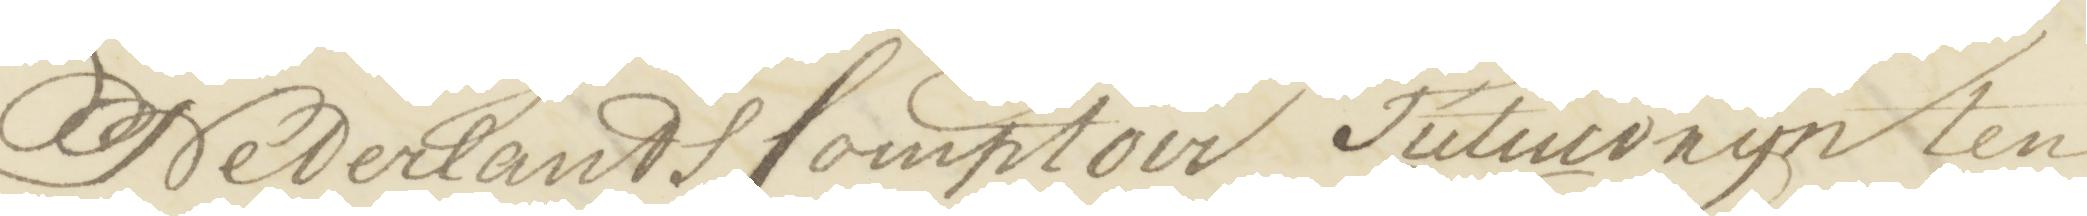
Nederlands Comptoir Tutucoryn ten
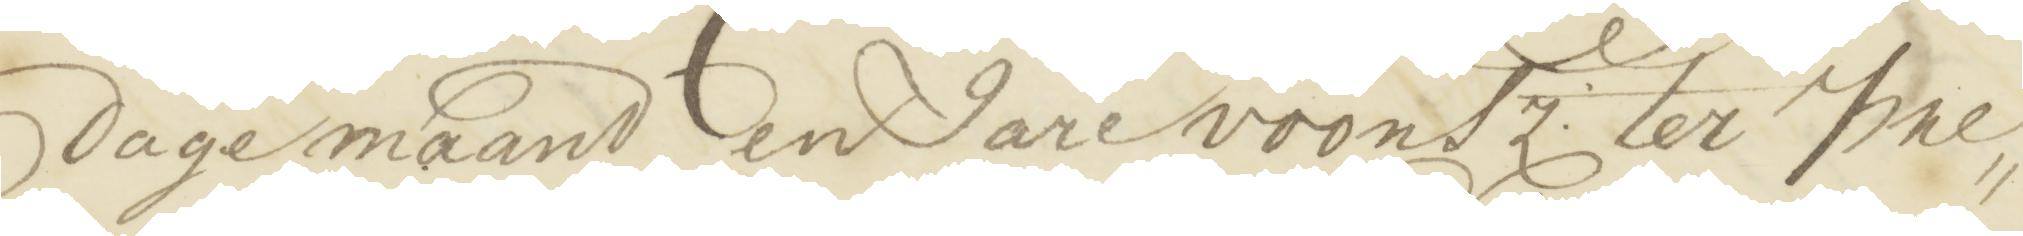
dage maand en Iare voorsz: ter pre„
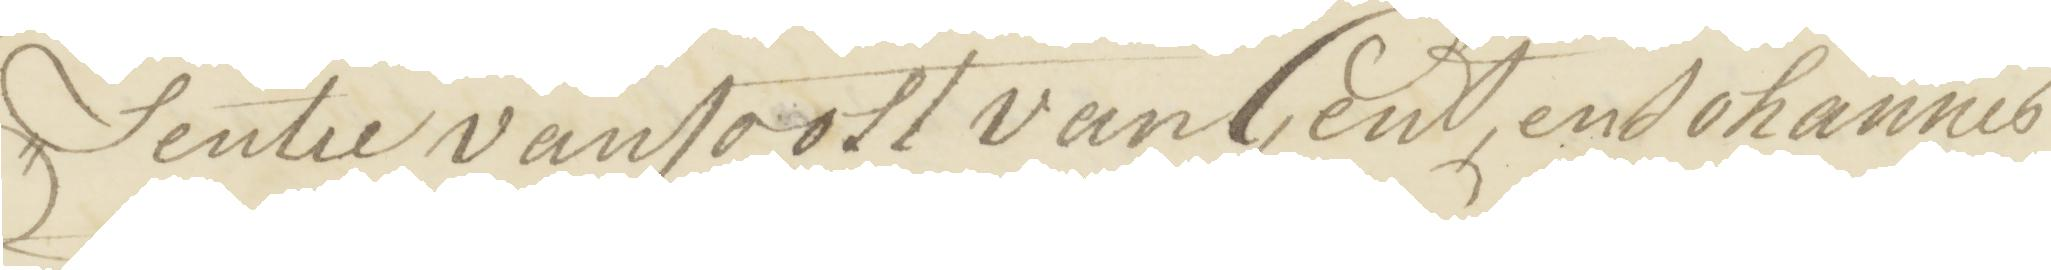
„sentie van joost van Gent, en Iohannes
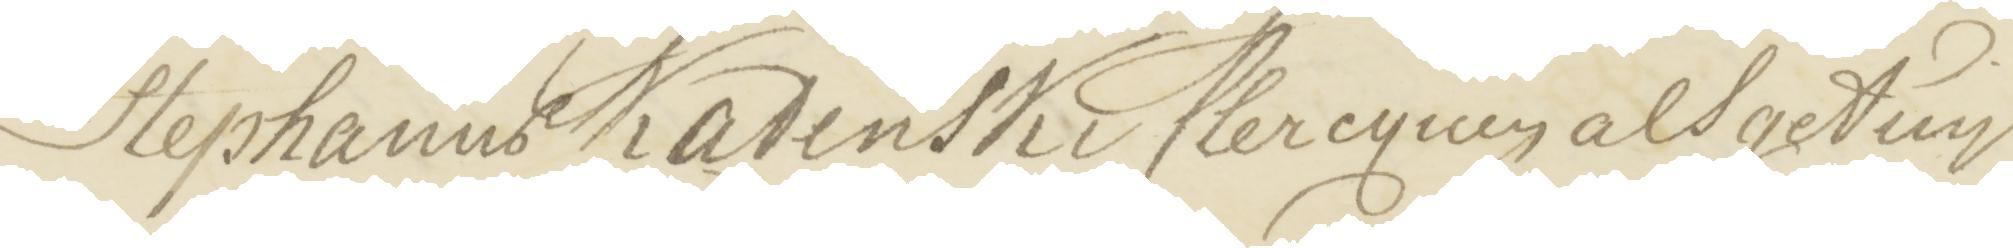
Stephanus Kadenski Clercquen als getuij
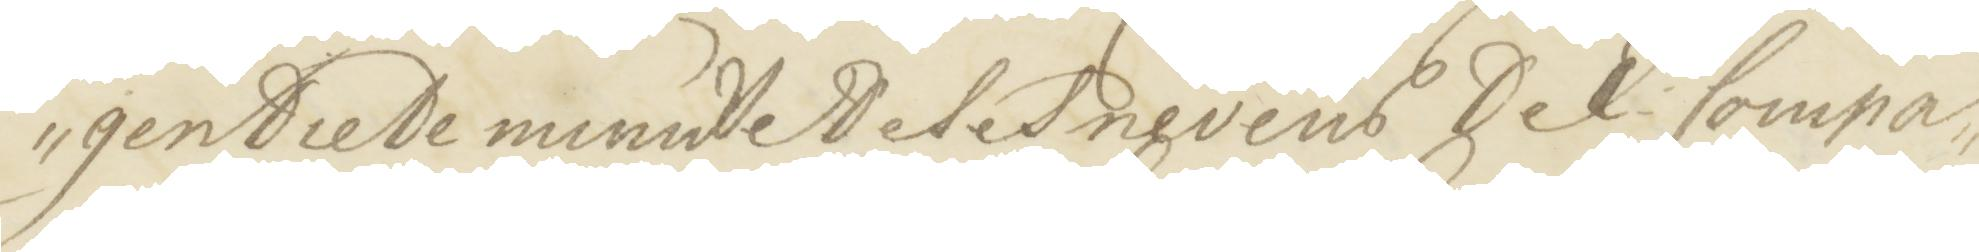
„gen die de minute deses nevens de E:s Compa„
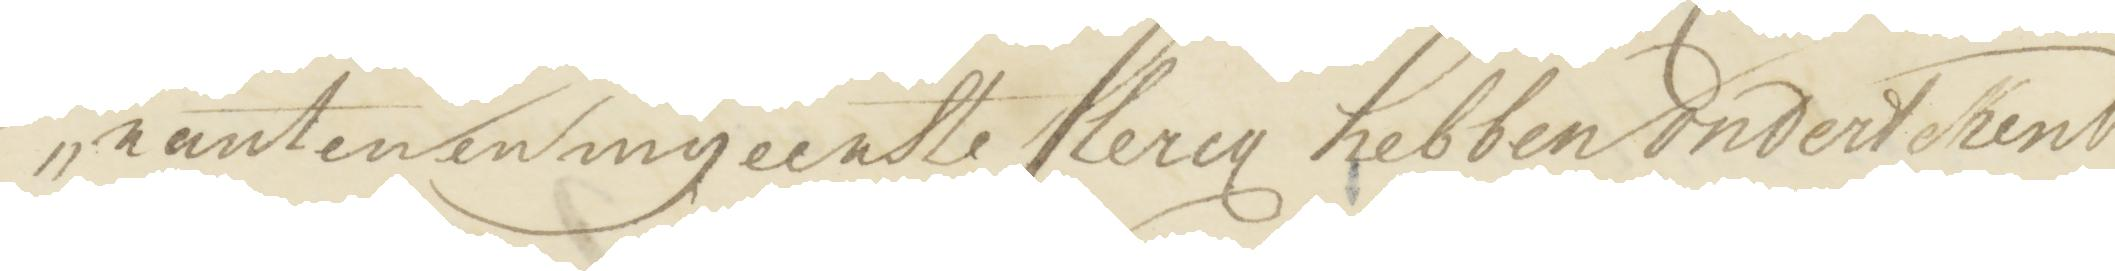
„ranten en mij eerste Clercq hebben ondertekend
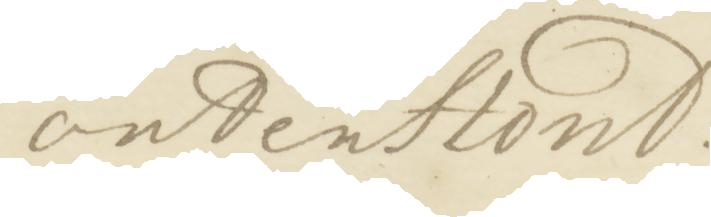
onder Stond
